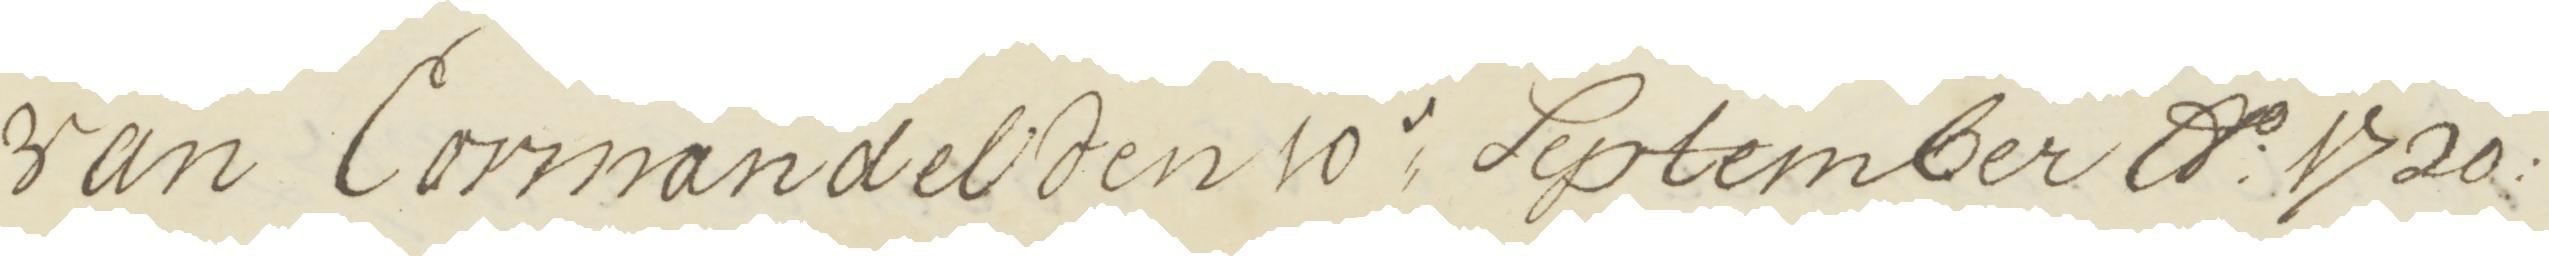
van Cormandel den 10„e September A:o 1720:
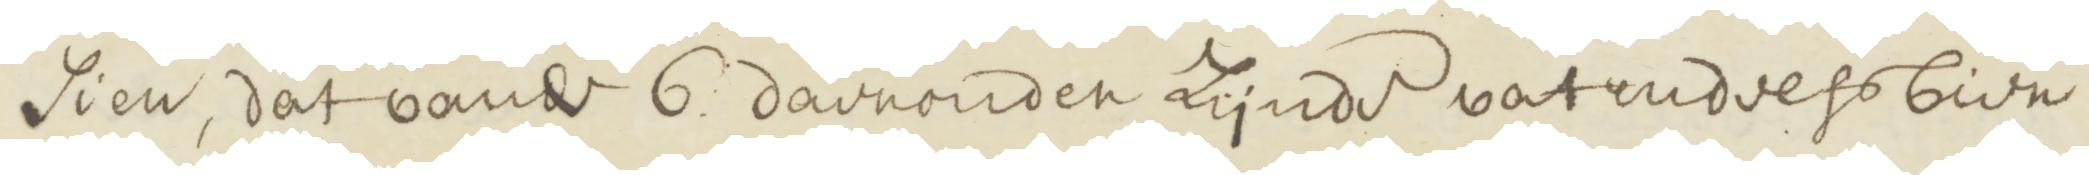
sien, dat vande 6: daeronder zijnde vaten delfs bier
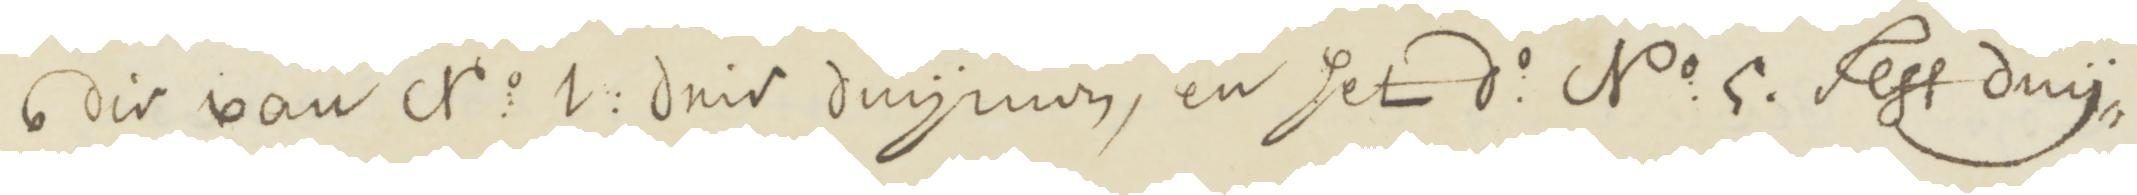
die van N:o 1: drie duijmen, en het d:o N:o 5. Elff duij„
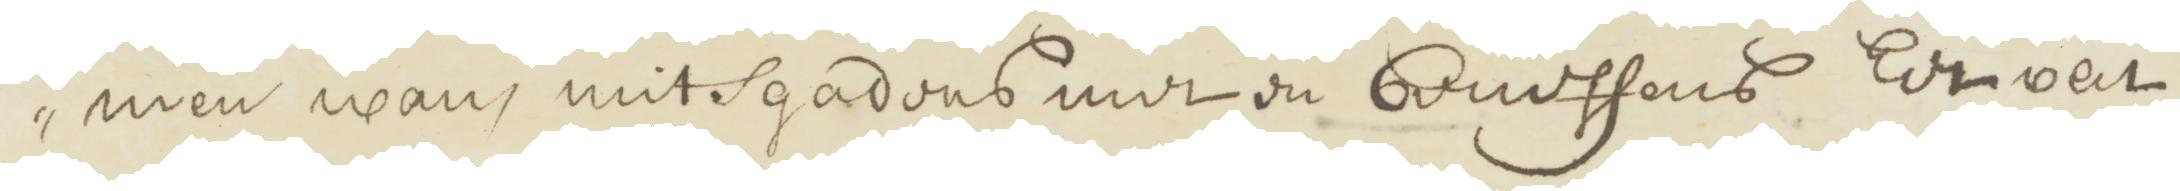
„men wan, mitsgaders met en beneffens het vat
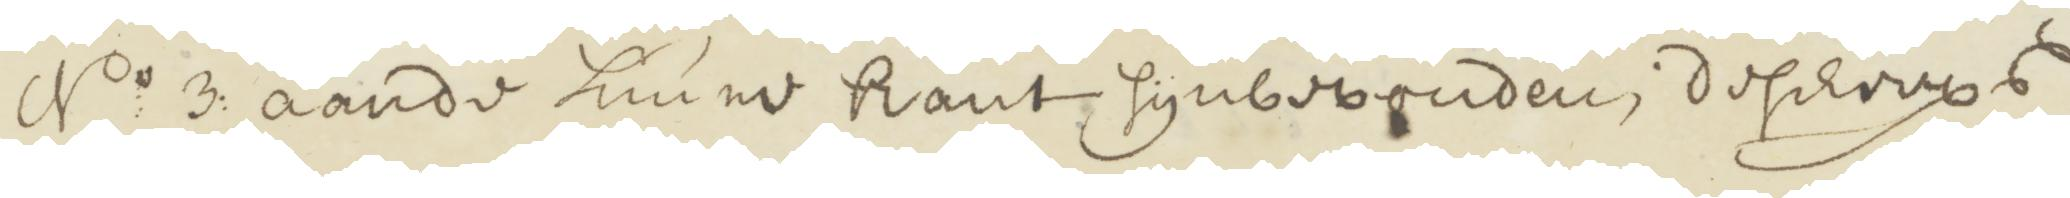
N:o 3: aande suure kant sijn bevonden; de scheeps
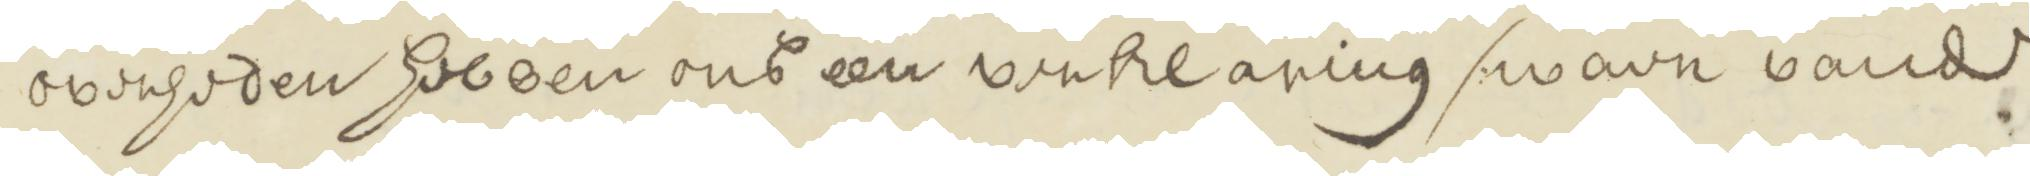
overheden hebben ons een verklaring /: waer vande
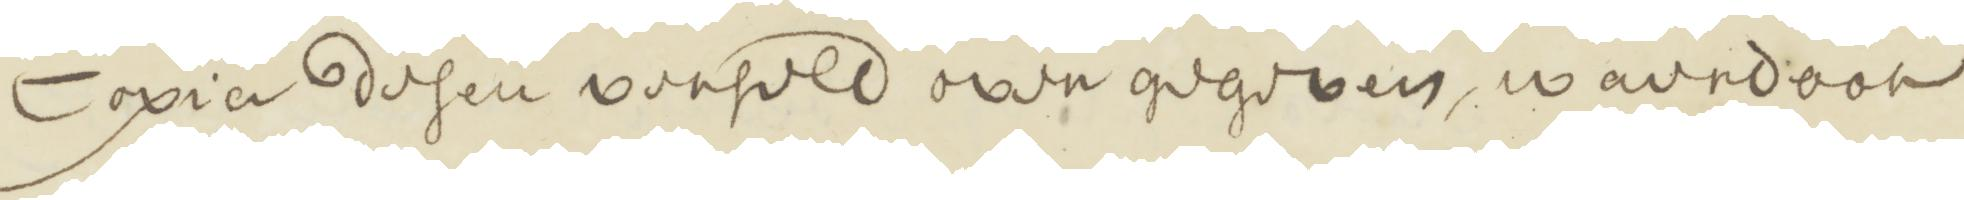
Copia desen verseld over gegeven, waerdoor
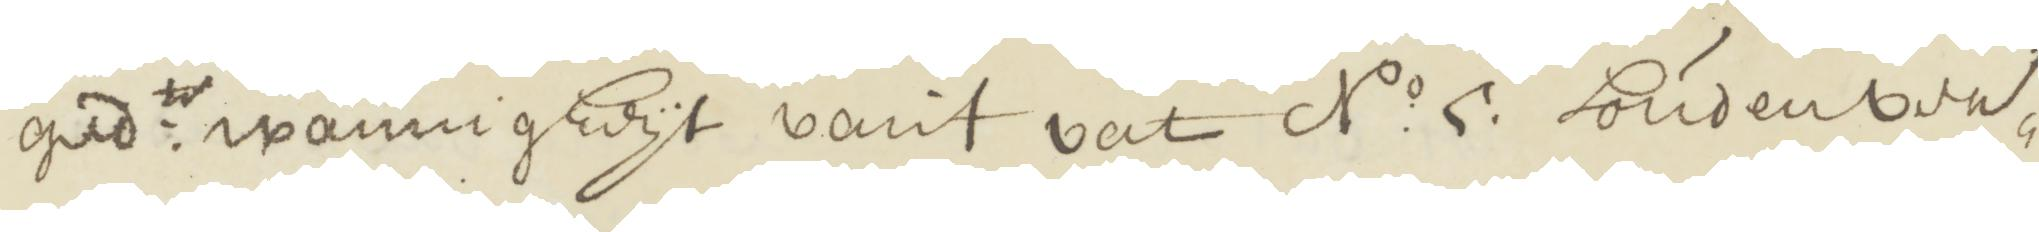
ged:te wannigheijt van’t vat N:o 5. souden ver„
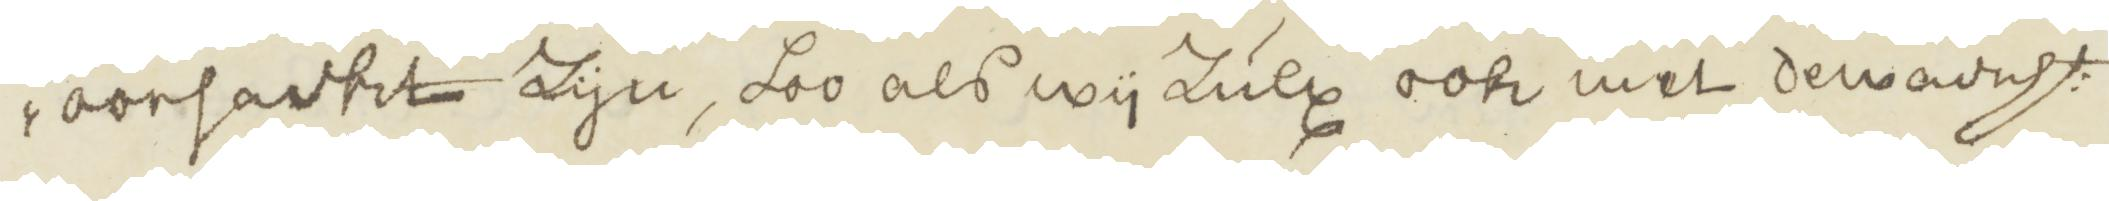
„oorsaekt zijn, soo als wij zulx ook met dewaerh:t
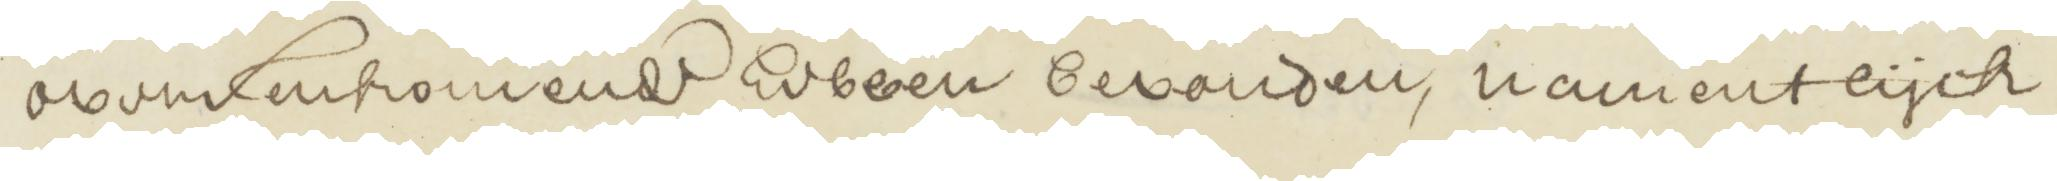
overeenkomende hebben bevonden, namentlijck
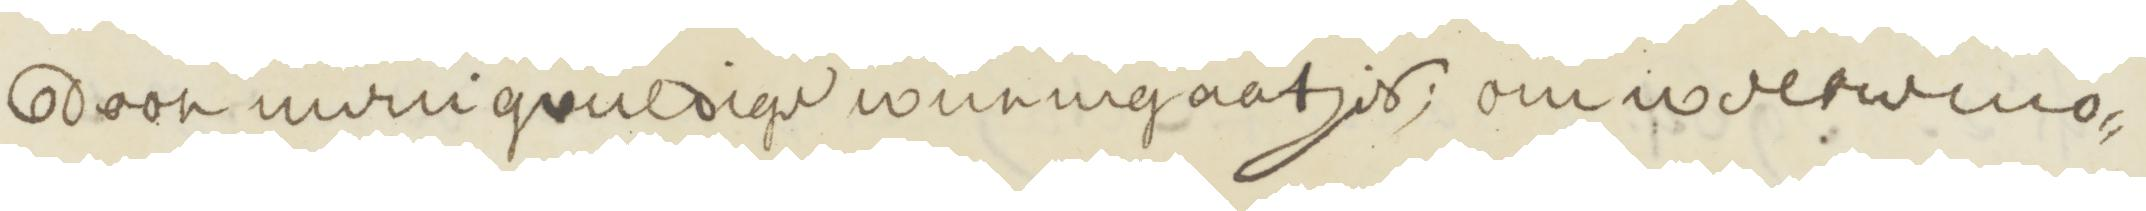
door menigvuldige wurmgaatjes; om welke mo„
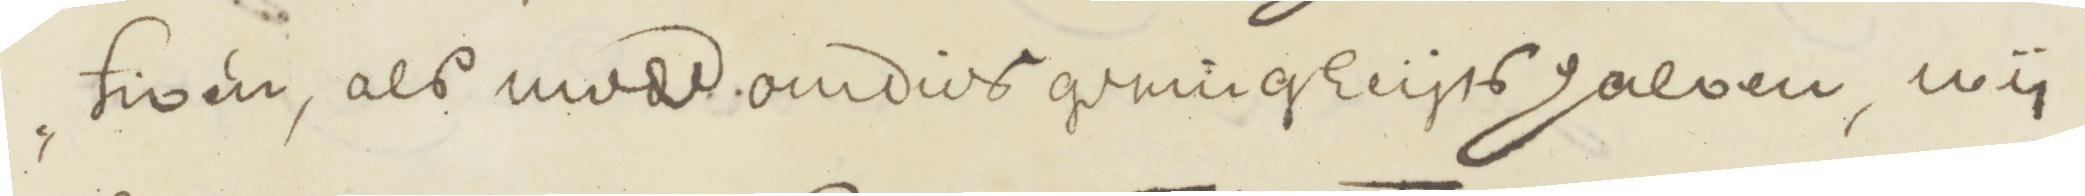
„tiven, als mede om dies geringheijtshalven, wij
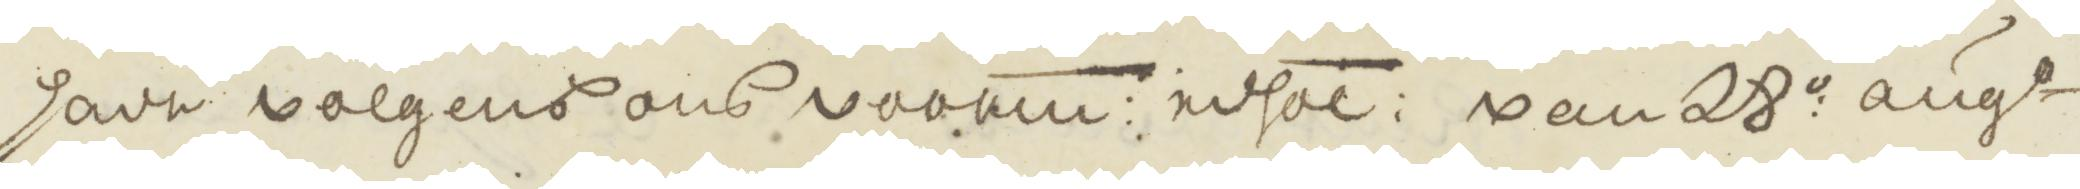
haer volgens ons voorm: resol: van 28:e aug=o
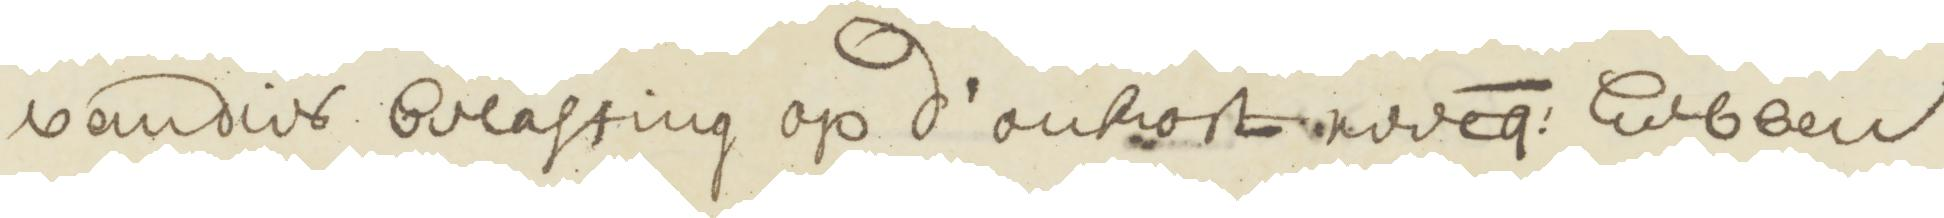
vandies belasting op d’onkost reecq: hebben
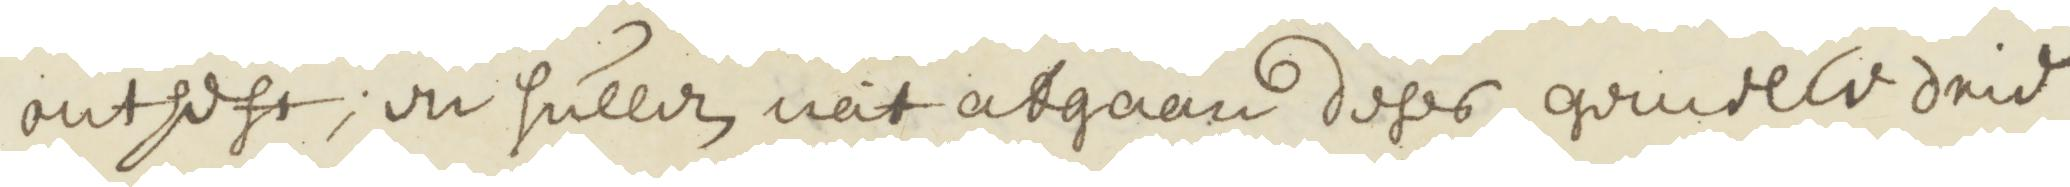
ontheft; en sullen neit afgaan deses, gemelte drie
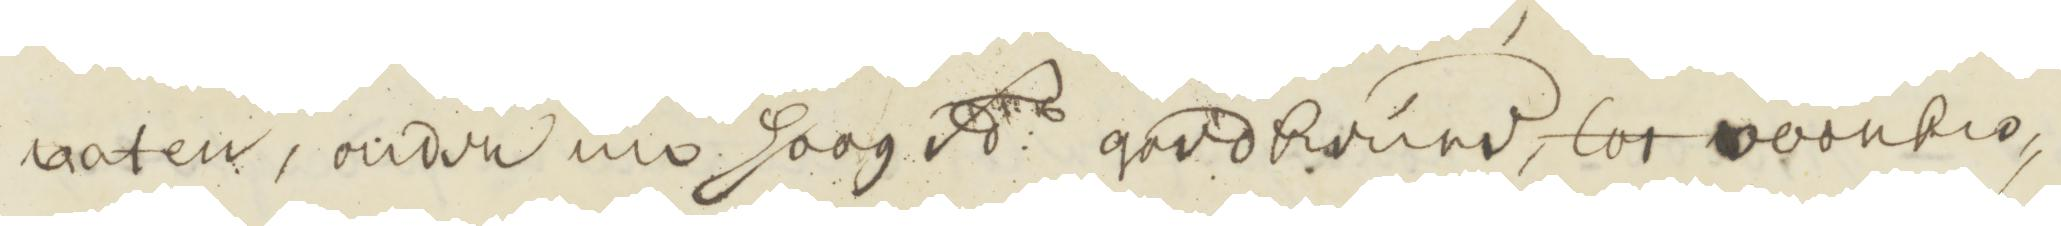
vaten, onder uw hoog Ed:s goedkeure, tot voorko„
